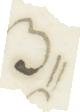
3„
